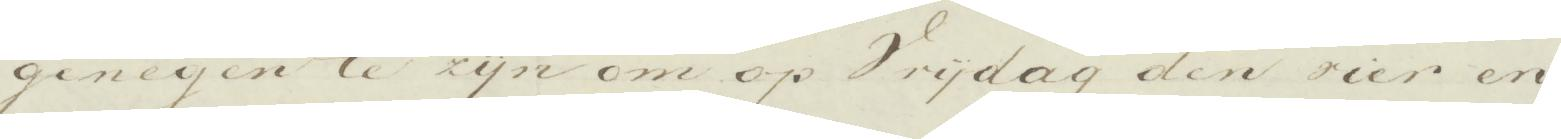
genegen te zijn om op Vrijdag den vier en
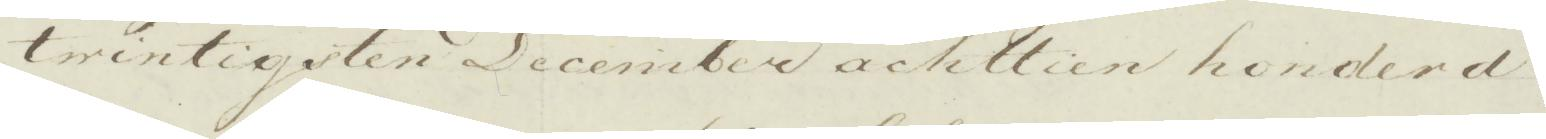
twintigsten December achttien honderd
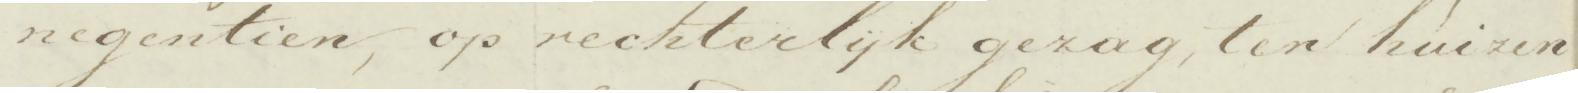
negentien, op rechterlijk gezag, ten huizen
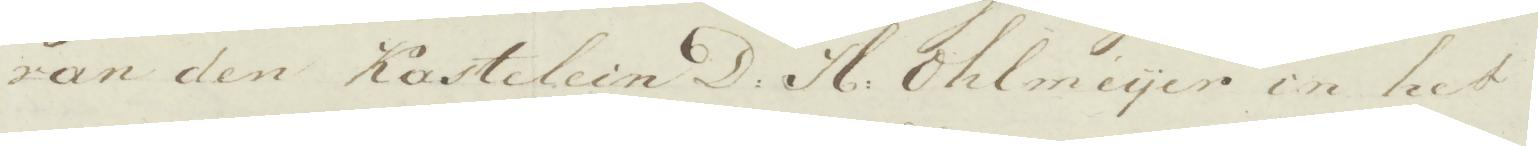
van den Kastelein D: H. Ohlmeijer in het
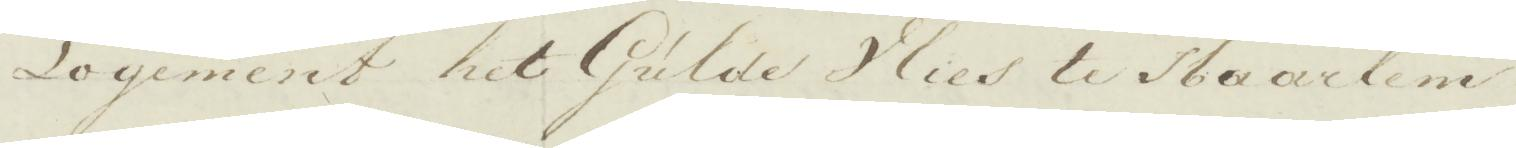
Logement het Gulde Vlies te Haarlem
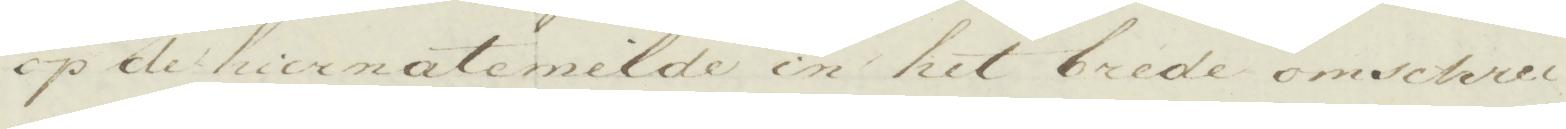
op de hiernatemelde in het brede omschree
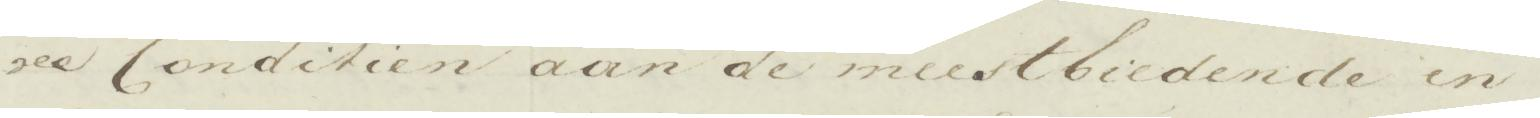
ve Conditien aan de meestbiedende en
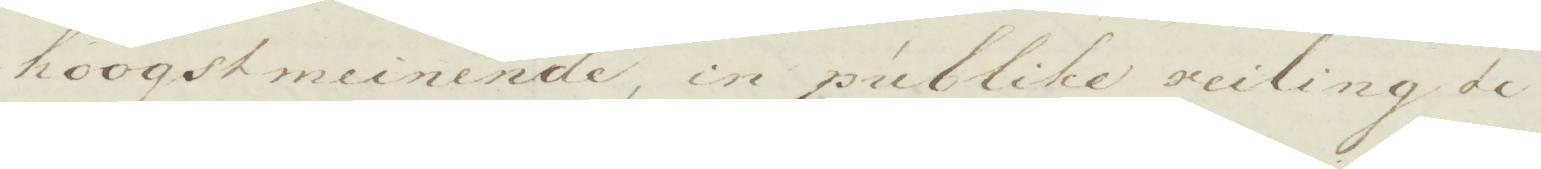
hoogstmeinende, in publike veiling te
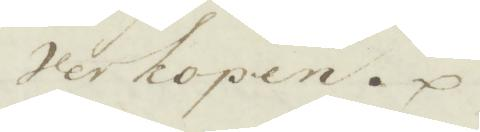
verkopen.
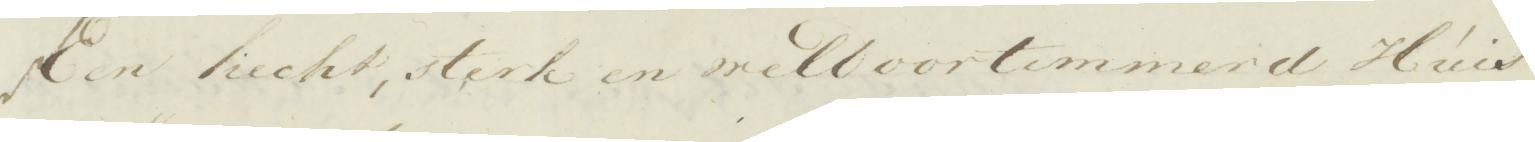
Een hecht, sterk en weldoortimmerd Huis
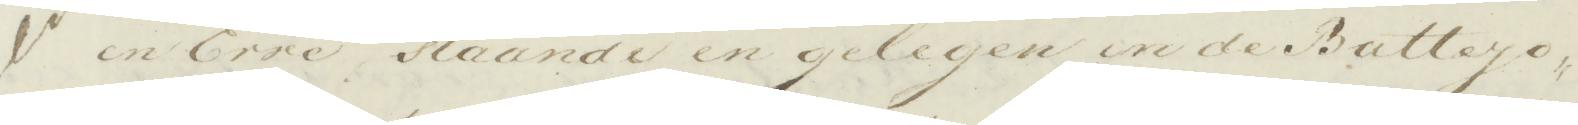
en Erve staande en gelegen in de Battejo„
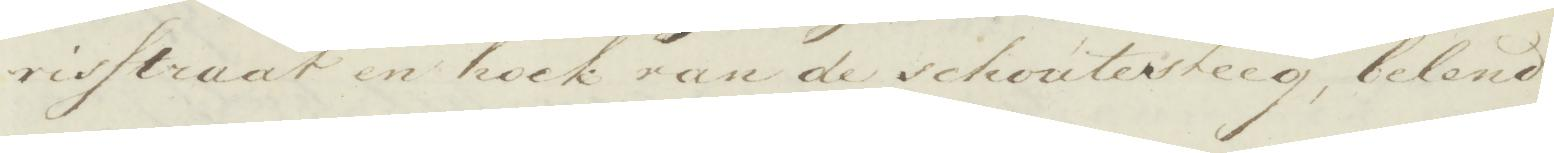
risstraat en hoek van de schoutesteeg, belend.
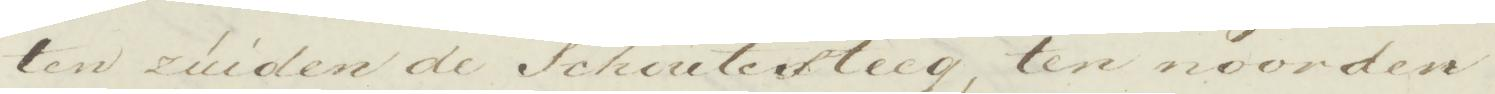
ten zuiden de schuitesteeg, ten noorden
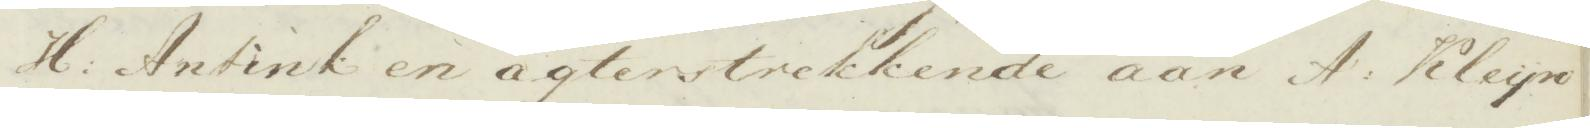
H: Antink en agterstrekkende aan A: Kleijn
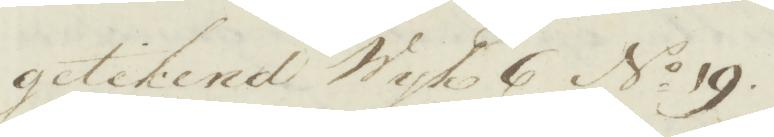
getekend Wyk 6 N-o 19.
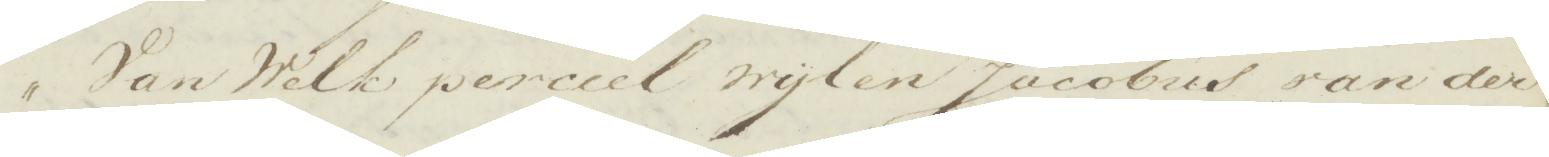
„ Van Welk perceel wijlen Jacobus van der
